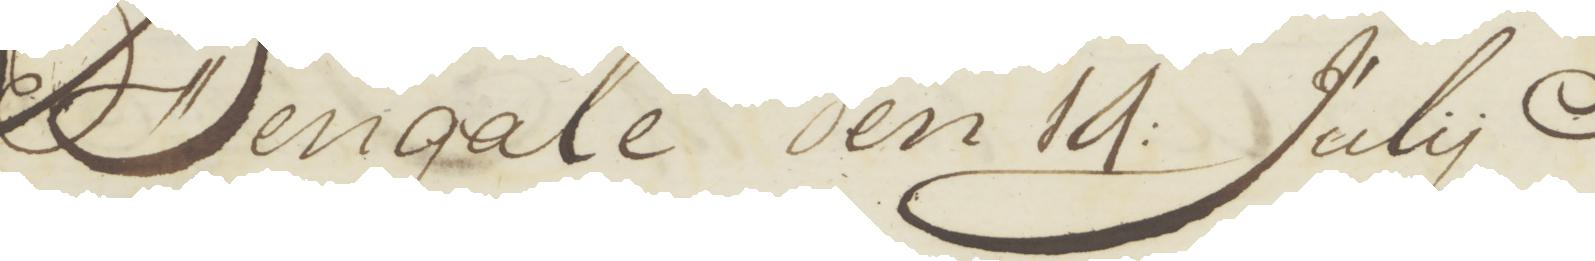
Bengale den 14: Julij
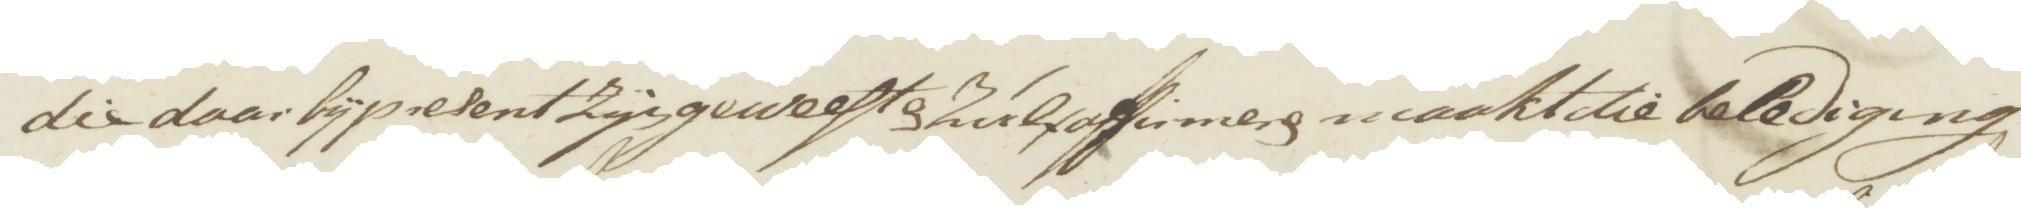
die daar bij present zijn geweest en zulx affirmeren maakt die belediging
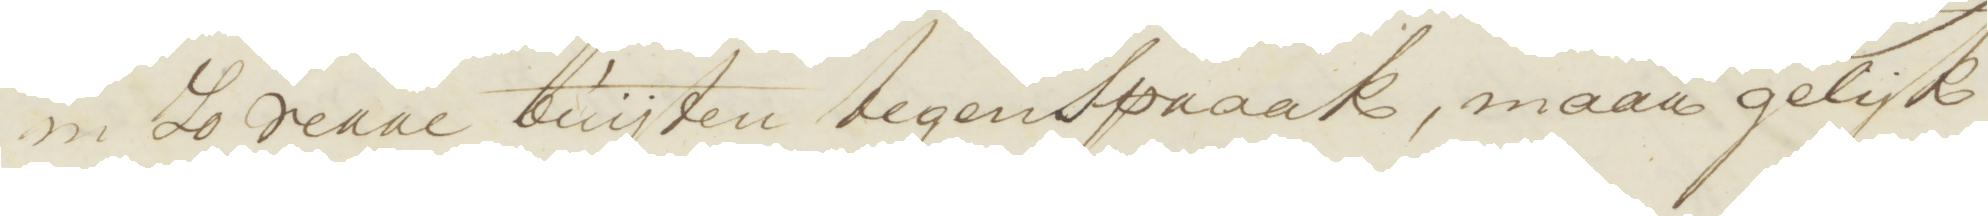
in zo verre buijten tegenspraak, maar gelijk
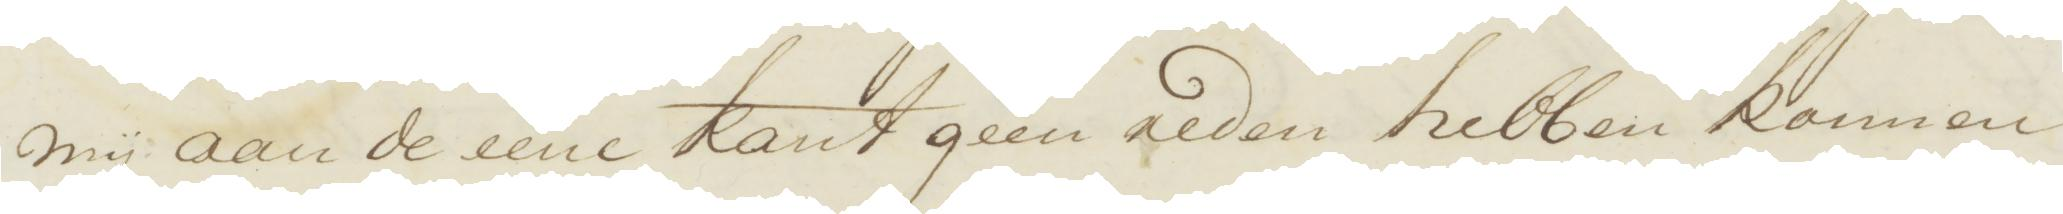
mij aan de eene kant geen reden hebben konnen
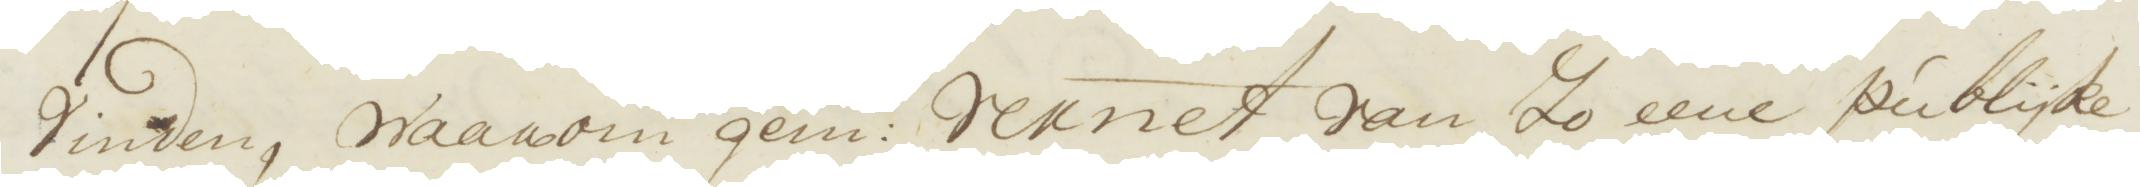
vinden, waarom gem: vernet van zo eene publijke
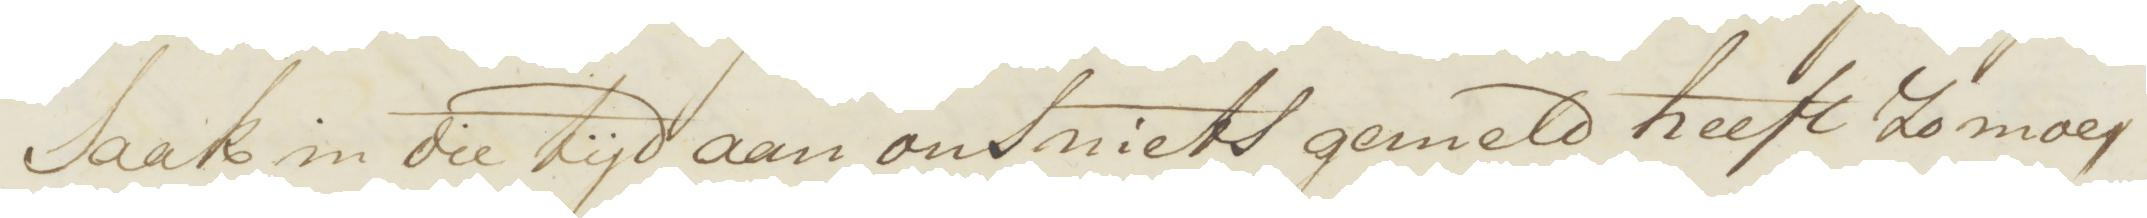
saak in die tijd aan ons niets gemeld heeft zo moe
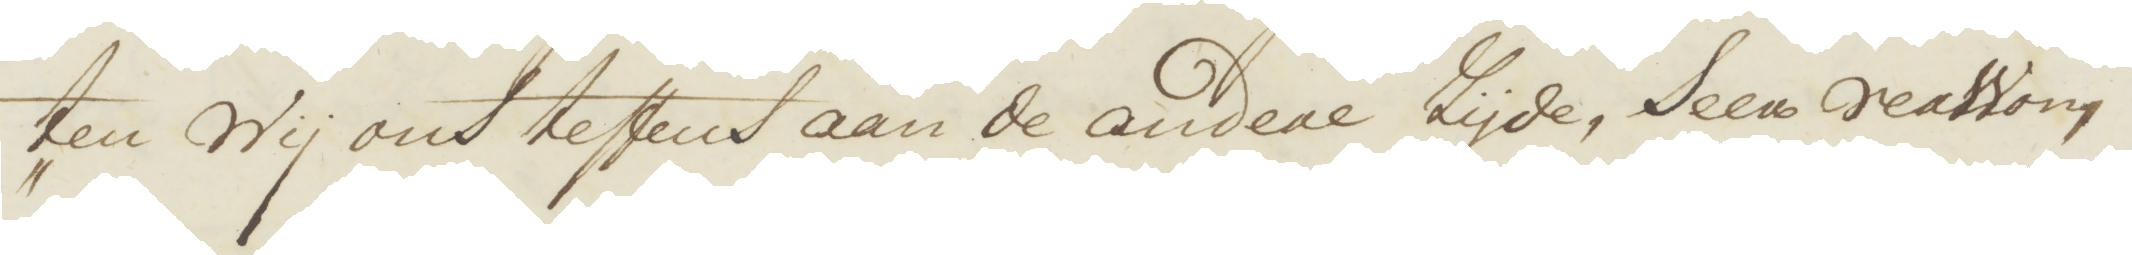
„ten wij ons teffens aan de andere zijde, seer verwon
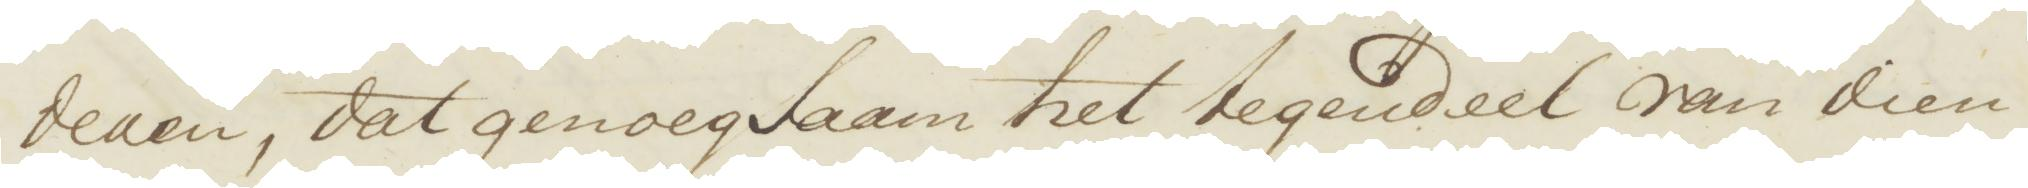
deren, dat genoegsaam het tegendeel van dien
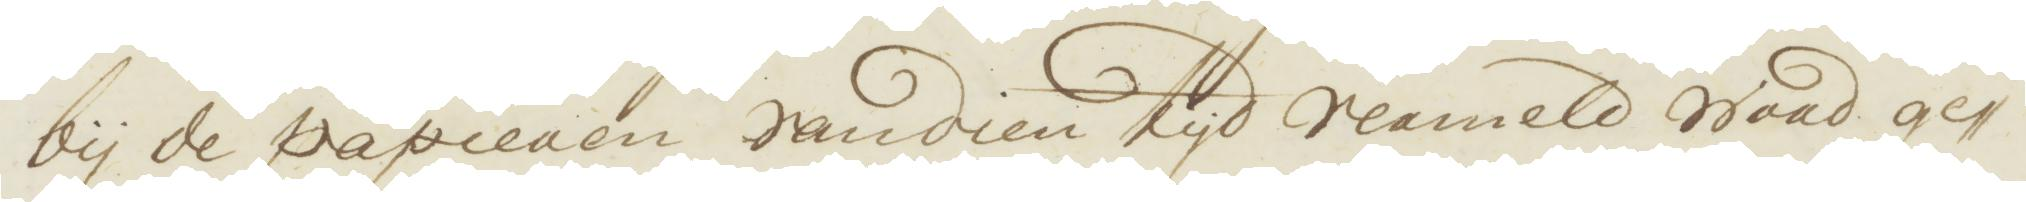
bij de papieren van dien tijd vermeld word ge„
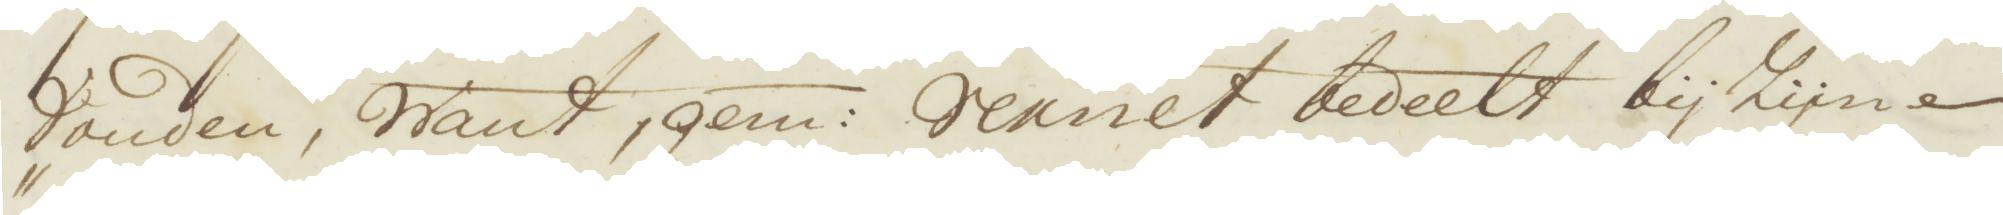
„sonden, want, gem: vernet bedeelt bij zijne
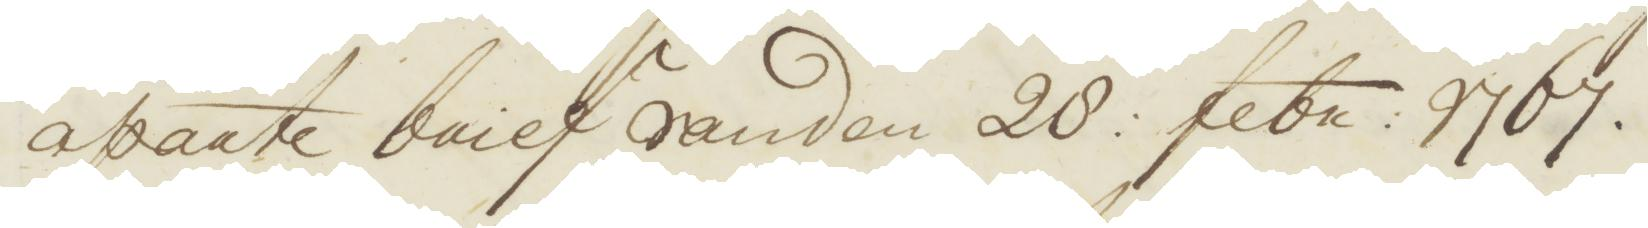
aparte brief van den 28: febr: 1767.
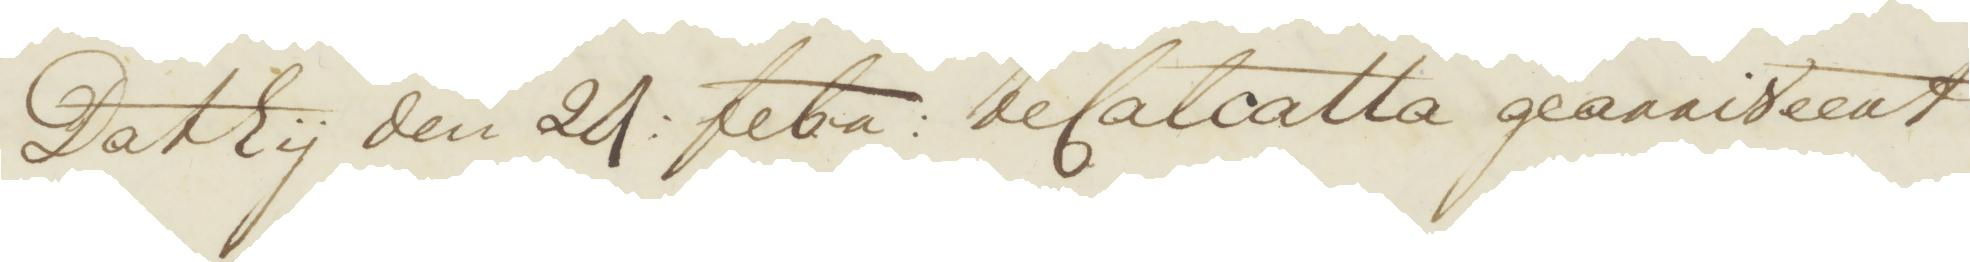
Dat hij den 24: febr: te Calcatta gearriveert
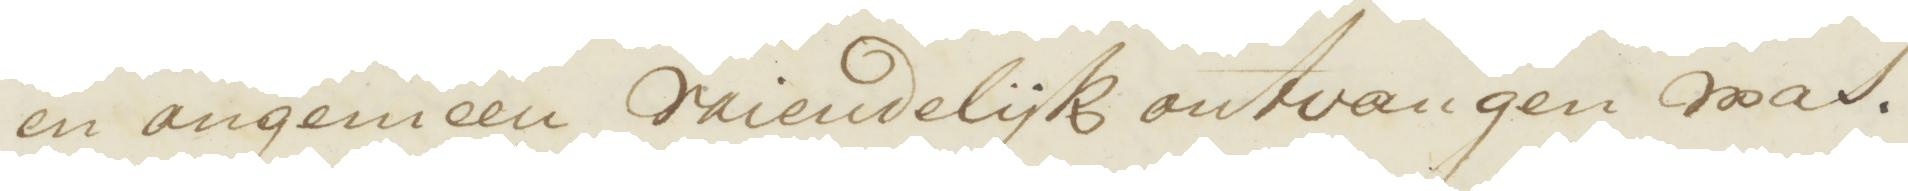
en ongemeen vriendelijk ontvangen was.
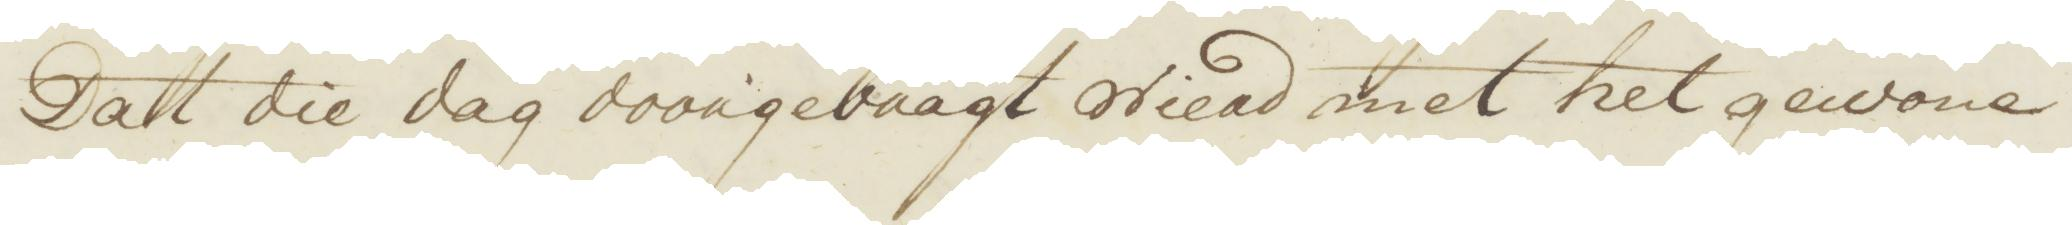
Datt die dag doorgebragt wierd met het gewone
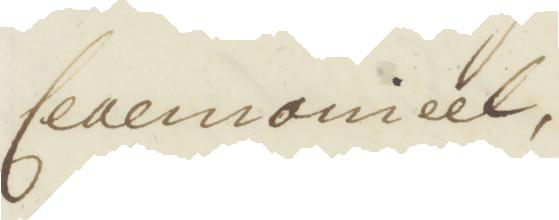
Ceremonieel,
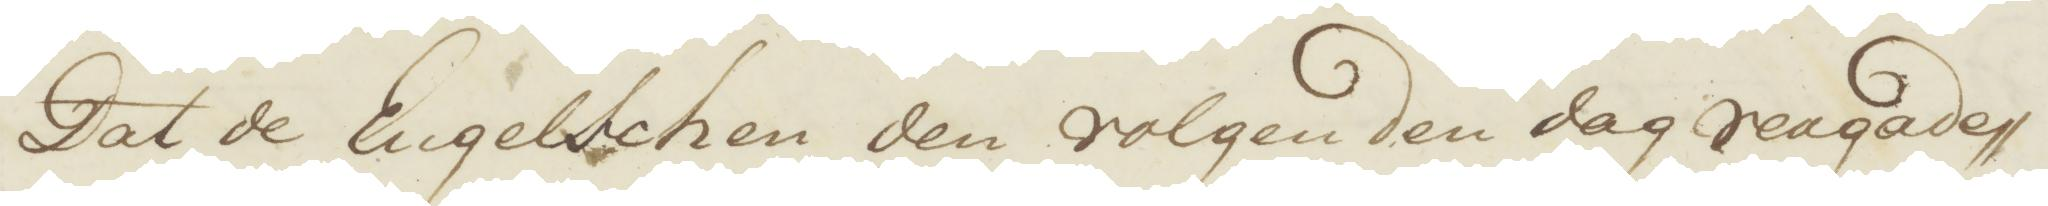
Dat de Engelschen den volgenden dag vergade„
